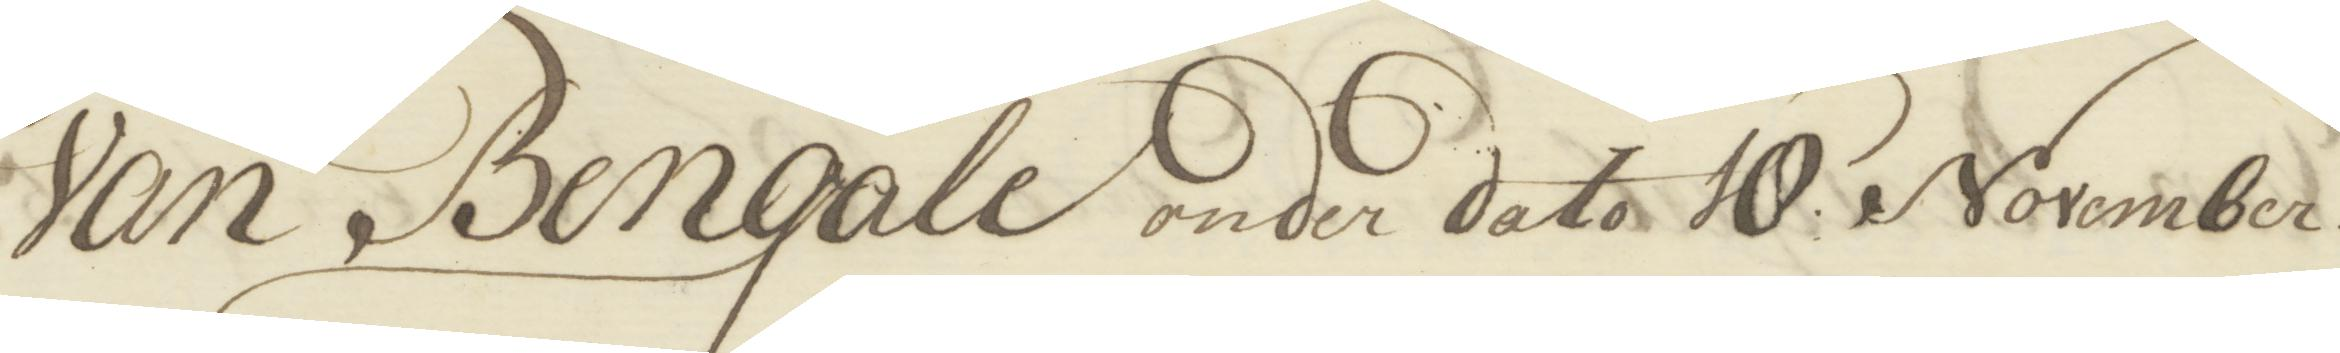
Van Bengale onder dato 18:' November
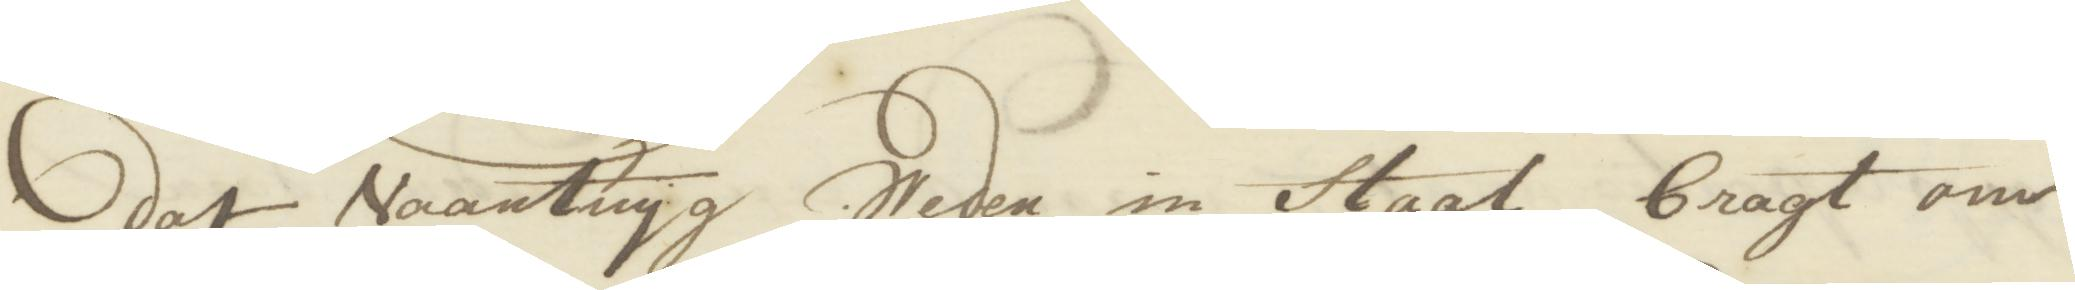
dat vaartuijg weder in staat bragt om
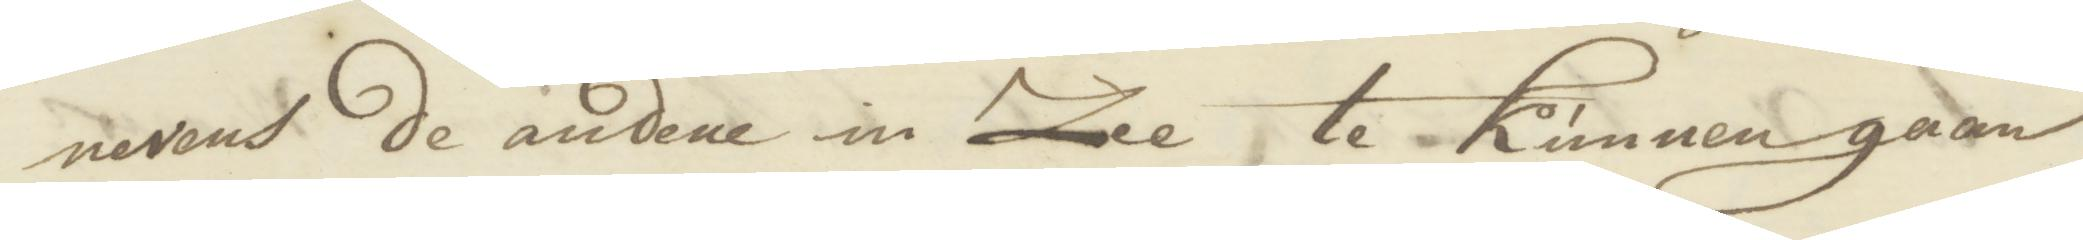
nevens de andere in Zee te kunnen gaan
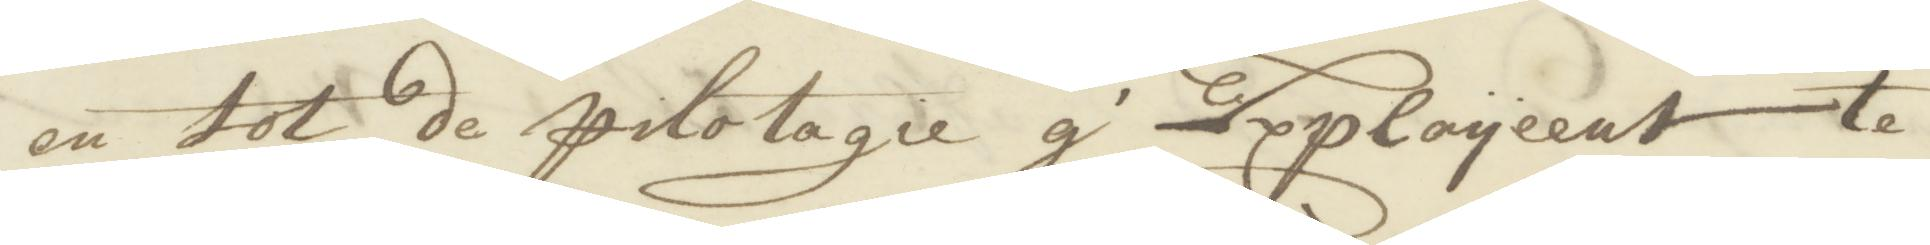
en tot de pilotagie g’Exploijeert te
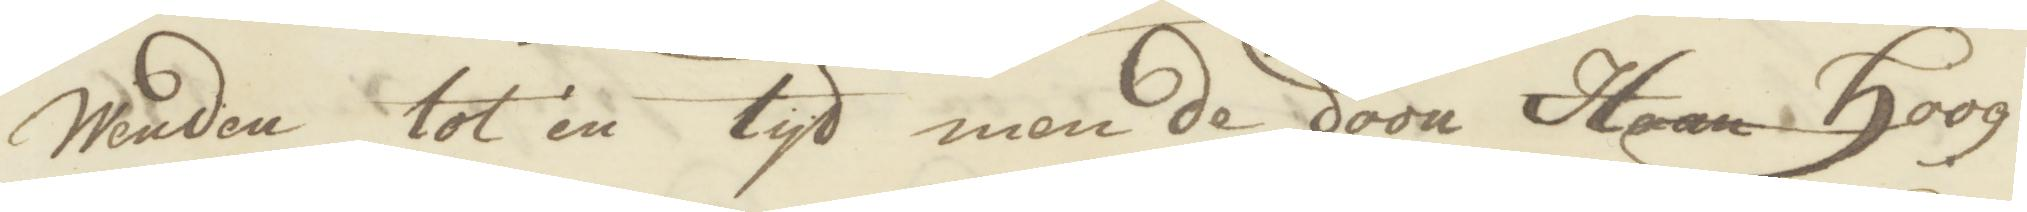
werden tot'en tijd men de door Haar Hoog
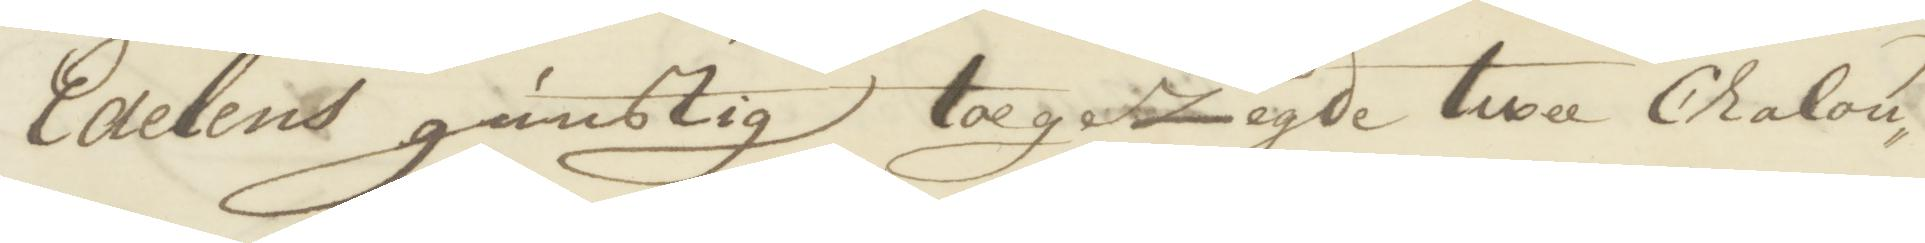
Edelens gunstig toegezegde twee Chalou„
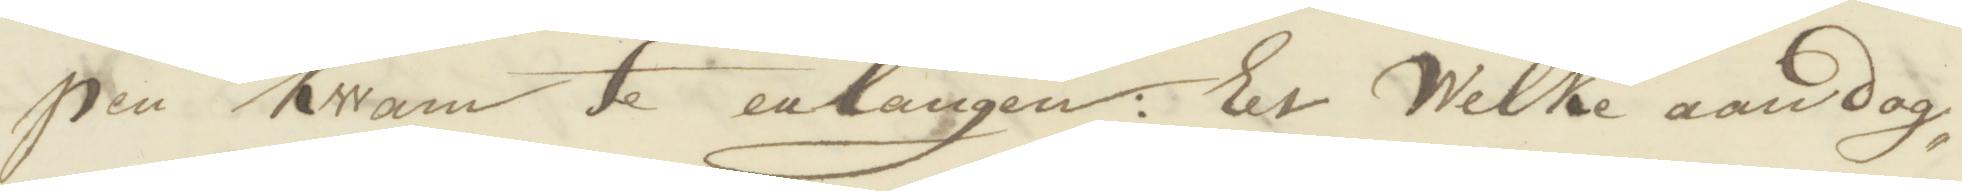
pen kwam te erlangen: het welke aan dag„
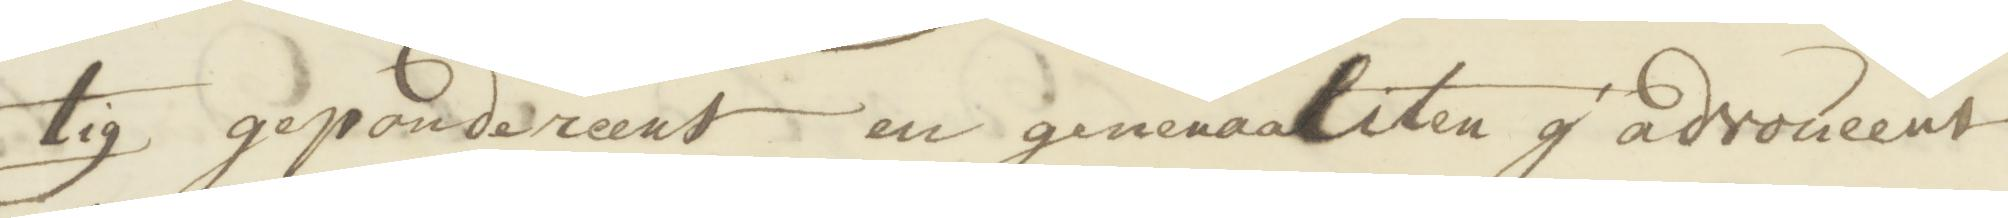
tig gepondereert en generaaliter g’advoueert
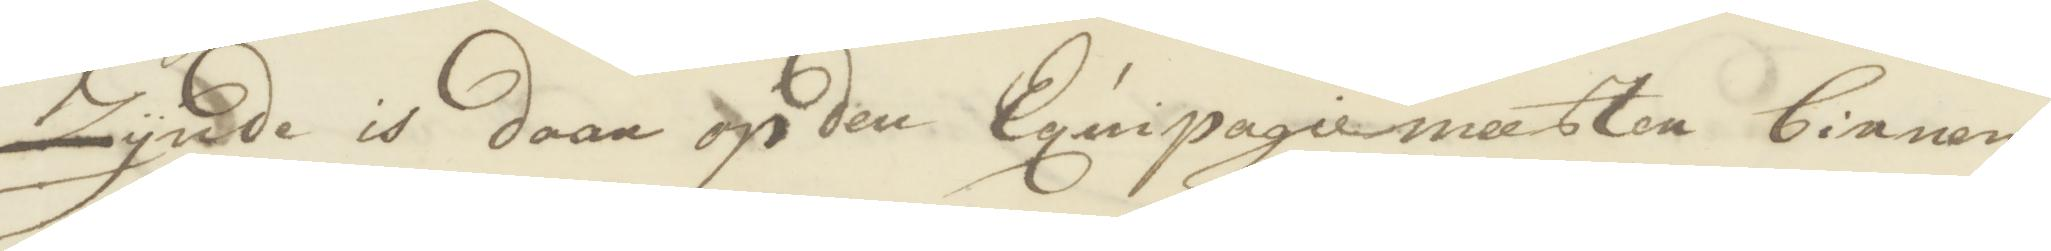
Zijnde is daar op den Equipagiemeester binnen
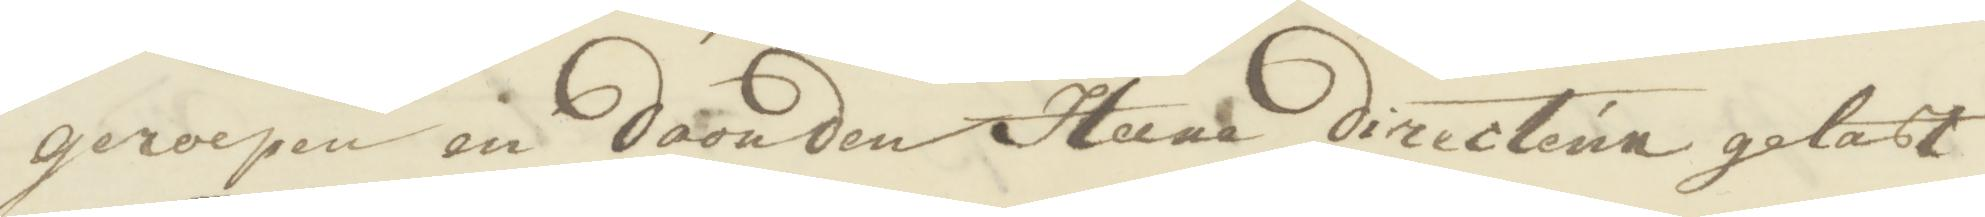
geroepen en door den Heere directeur gelast
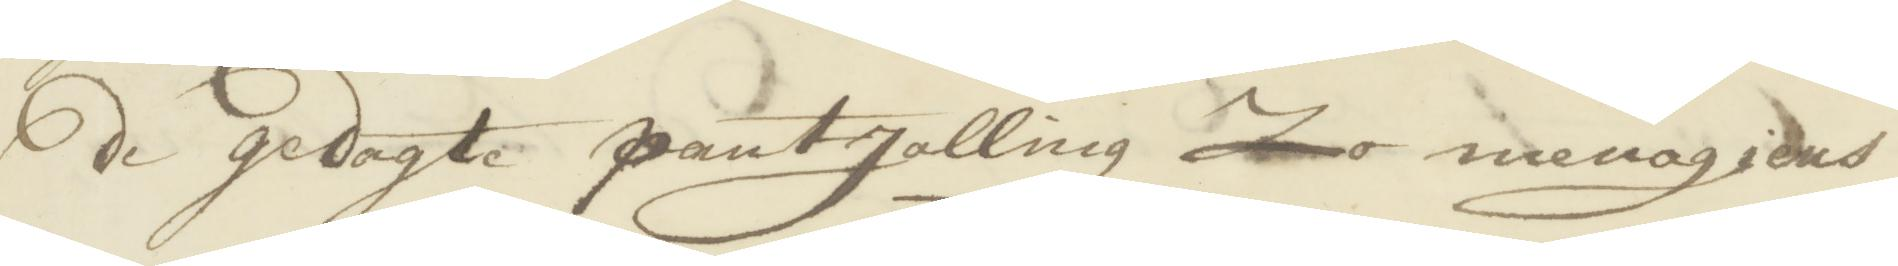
de gedagte pantjalling Zo menagiers
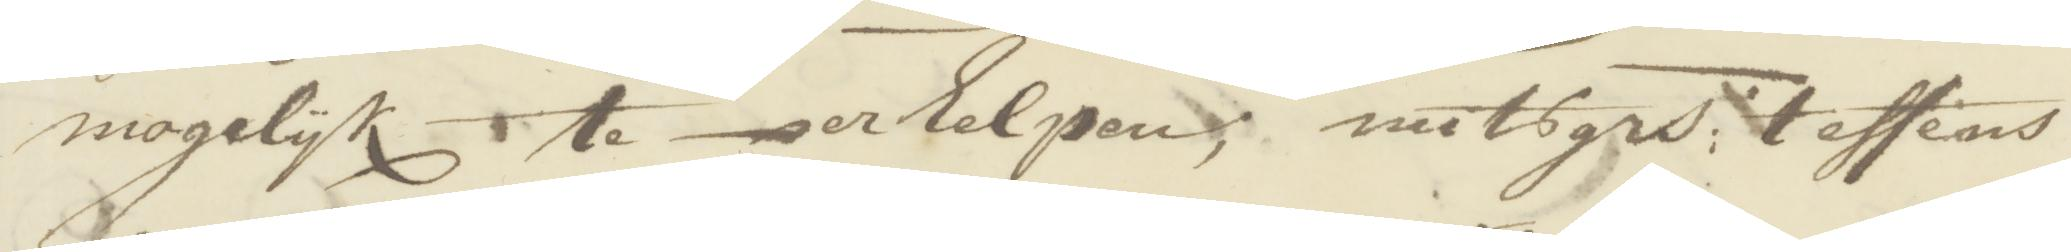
mogelijk te verhelpen mitsgrs: teffens
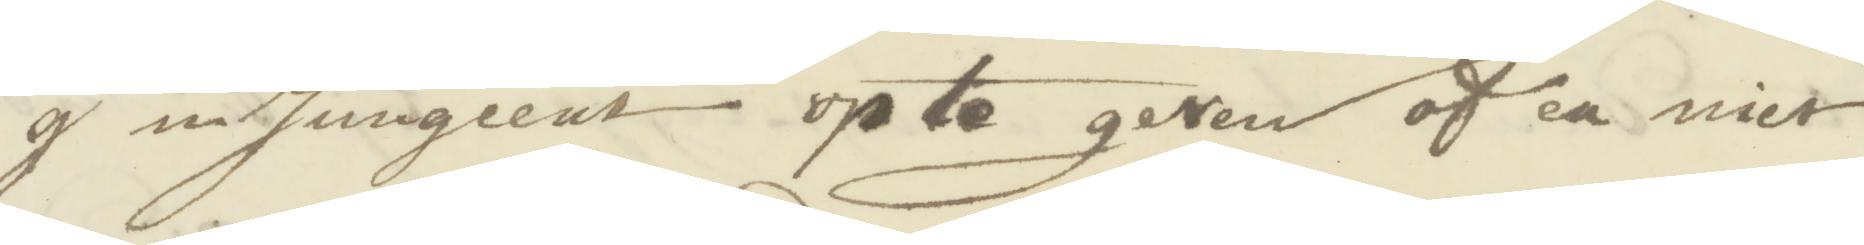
g’ injurgeert op te geven of er niet
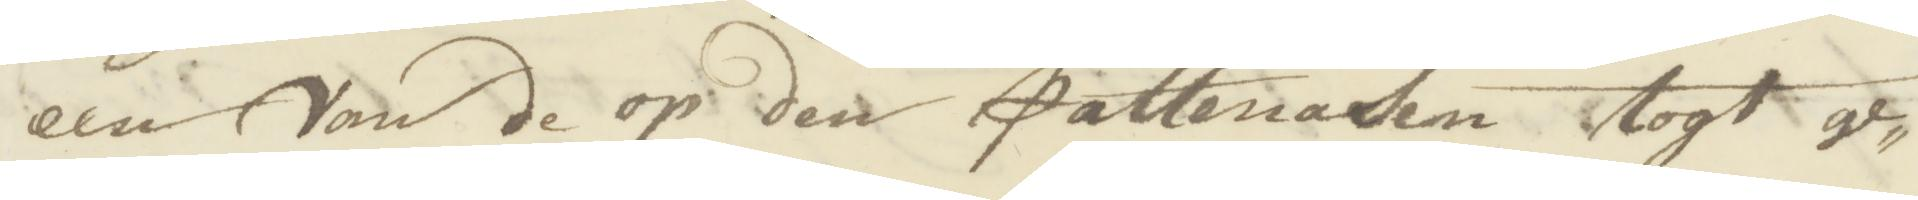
een van de op den pattenasen togt ge„
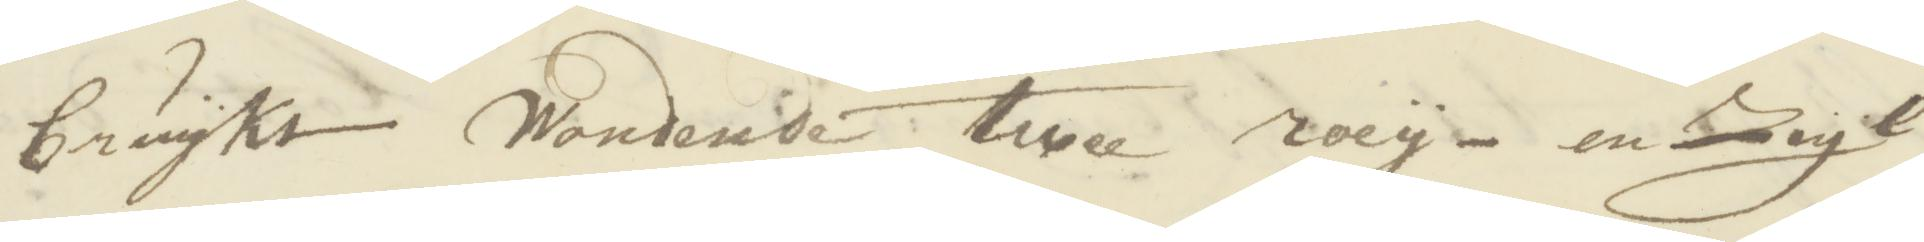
bruijkt wordende twee roeij- en Zijl
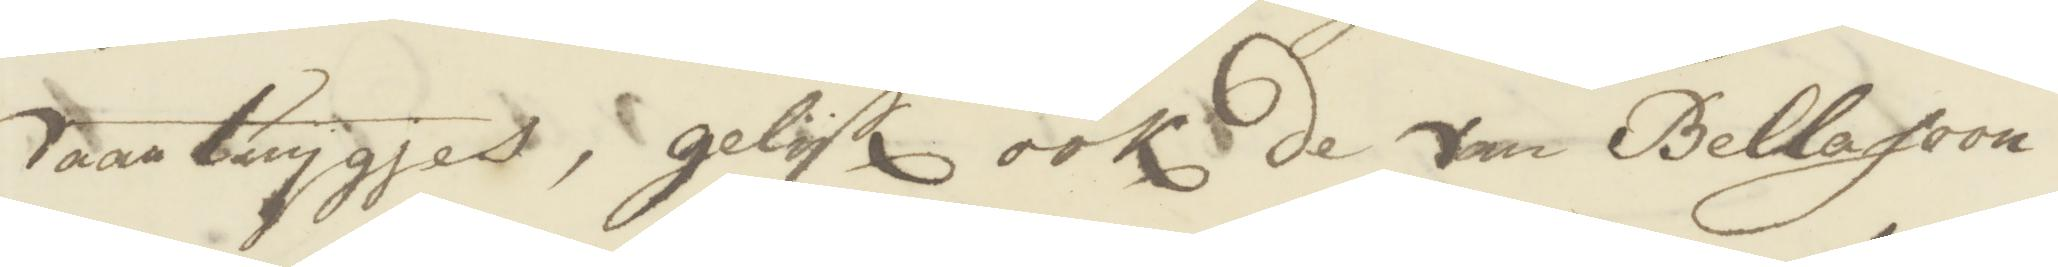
vaartuijgjes, gelijk ook de voor Bellasoor
